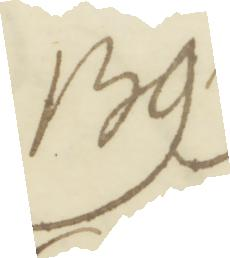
1393
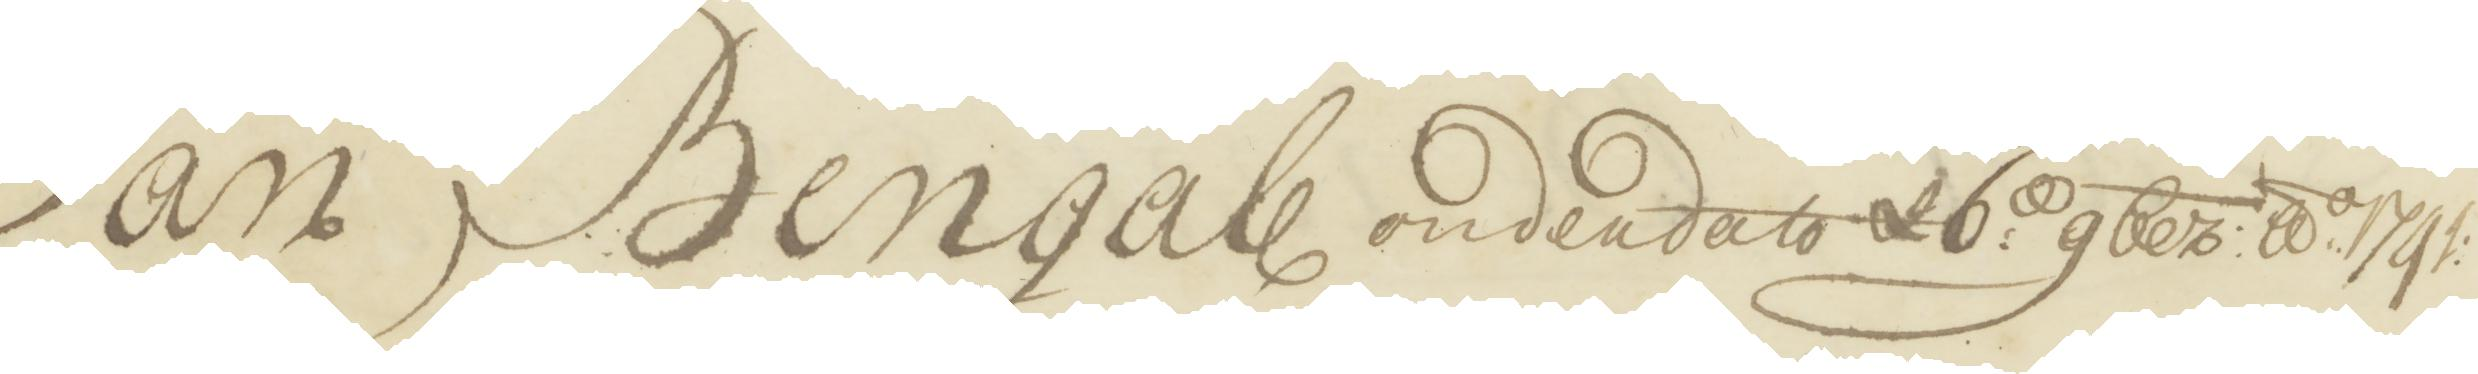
Van Bengale onderdato 26:' 9ber: a„o 1741:
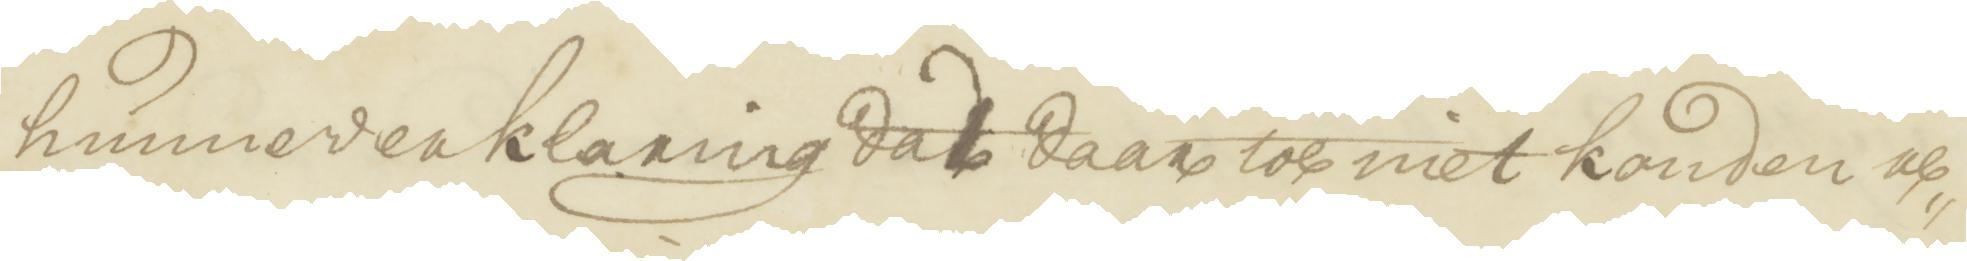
hunne verklaring dat daar toe niet konden re„
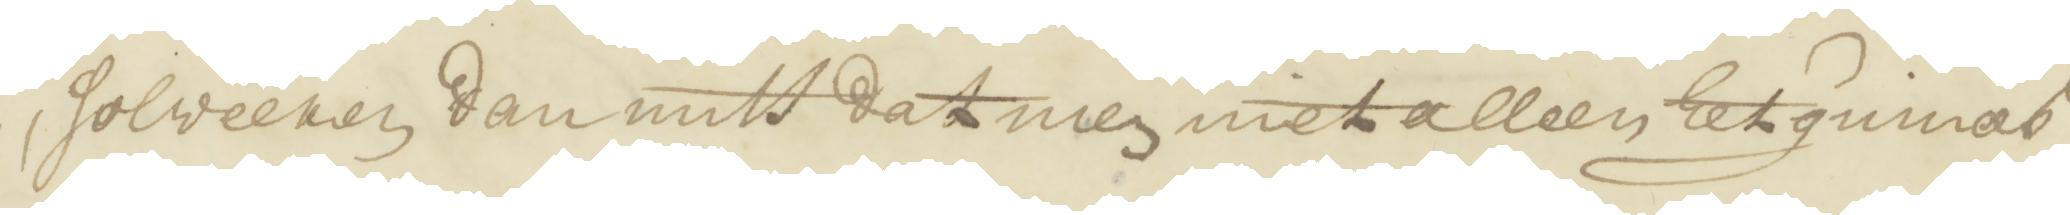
„solveeren dan mits dat men niet alleen het guinas
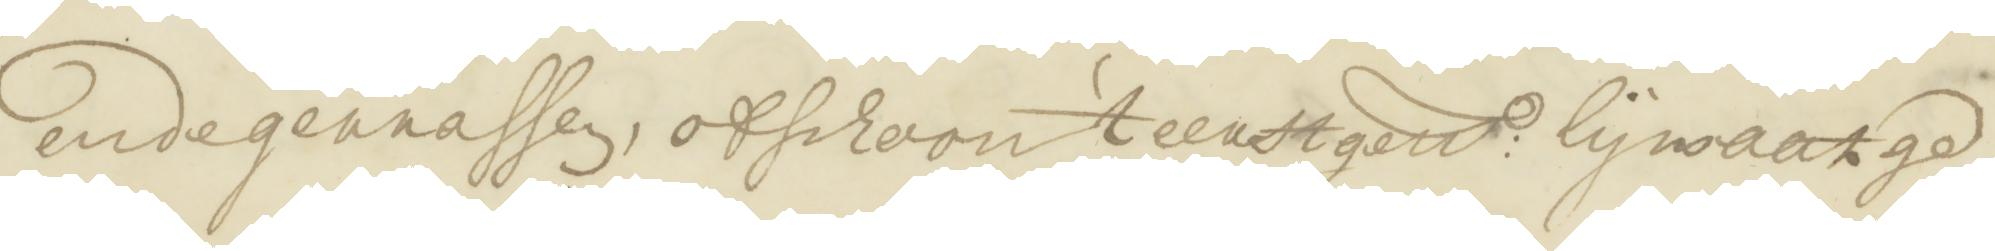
en de gerrassen, ofschoon 't eerstgen:' lijwaatge
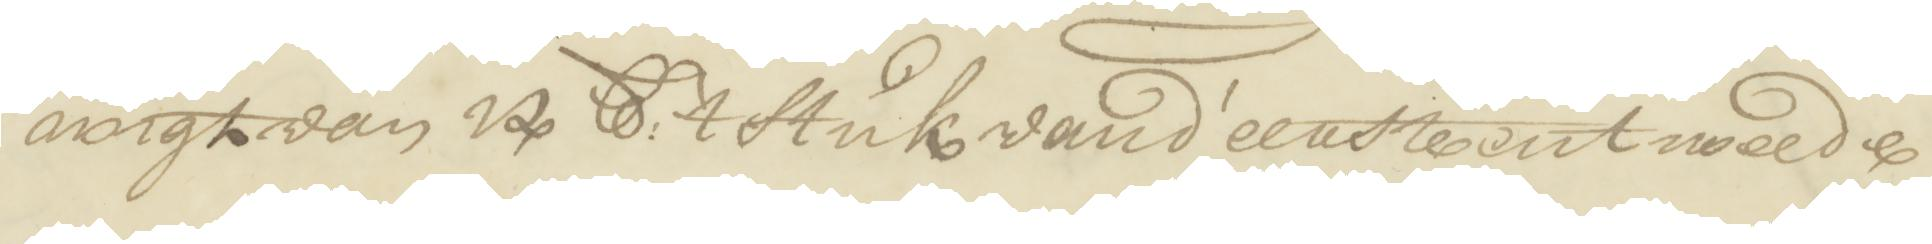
wigt van 12 lb: 't stuk van d’eerste entweede
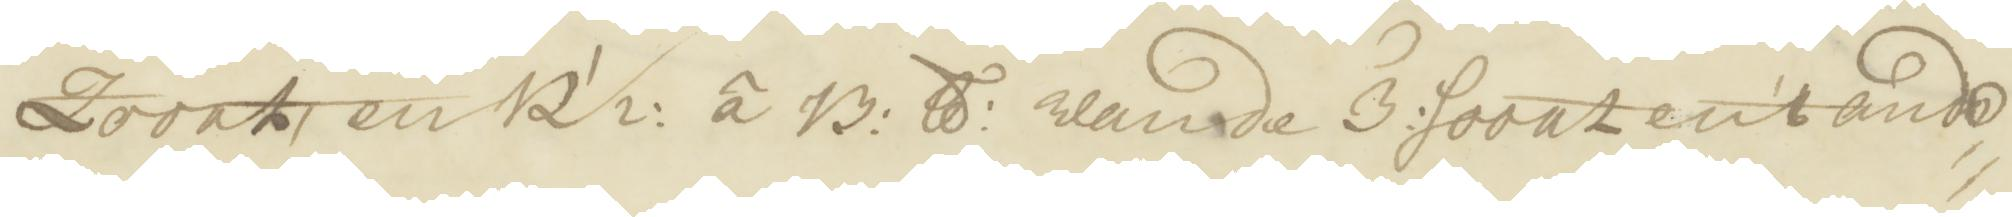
zoort, en 12½: â 13: lb: van de 3:' soort en 't ande„
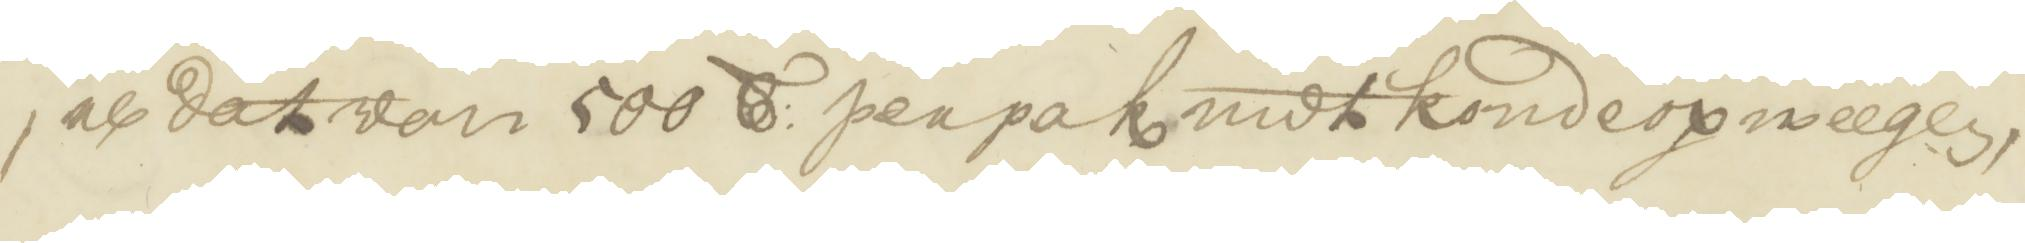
„re dat van 500 lb: per pak niet konde op weegen,
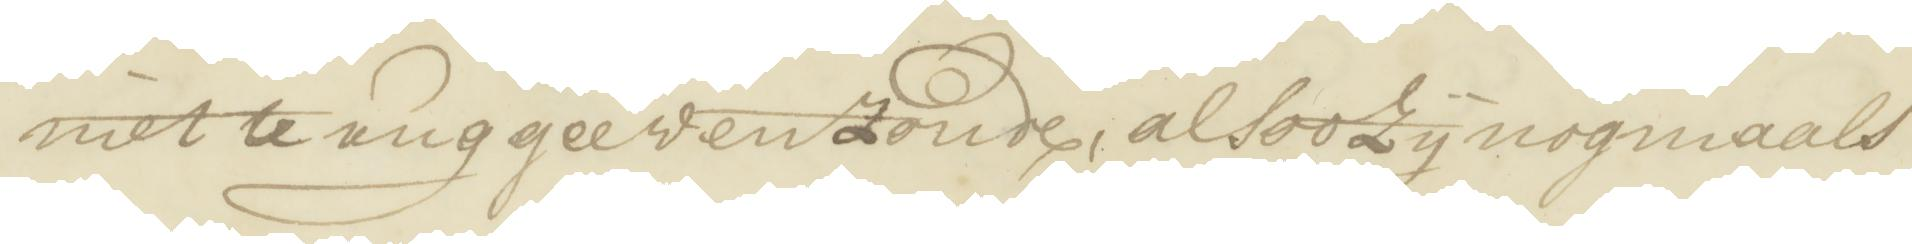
niet te rug geeven zoude, alsoo zij nogmaals
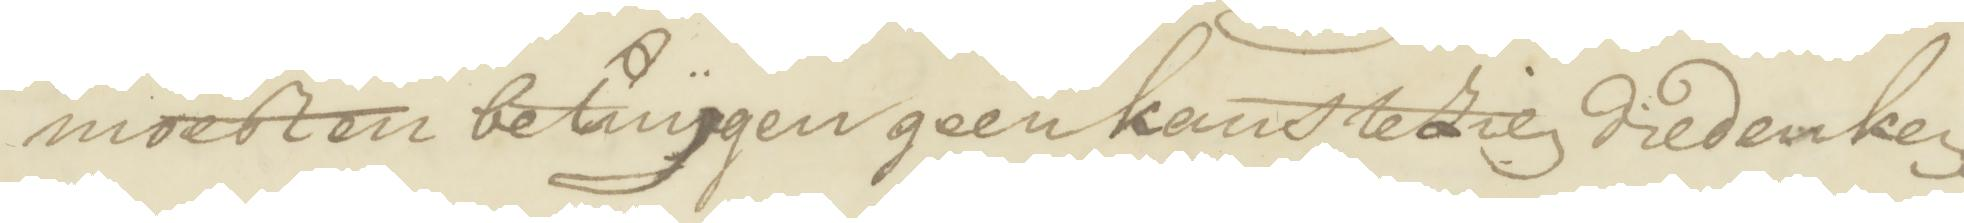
moesten betuijgen geen kans te zien die deeken
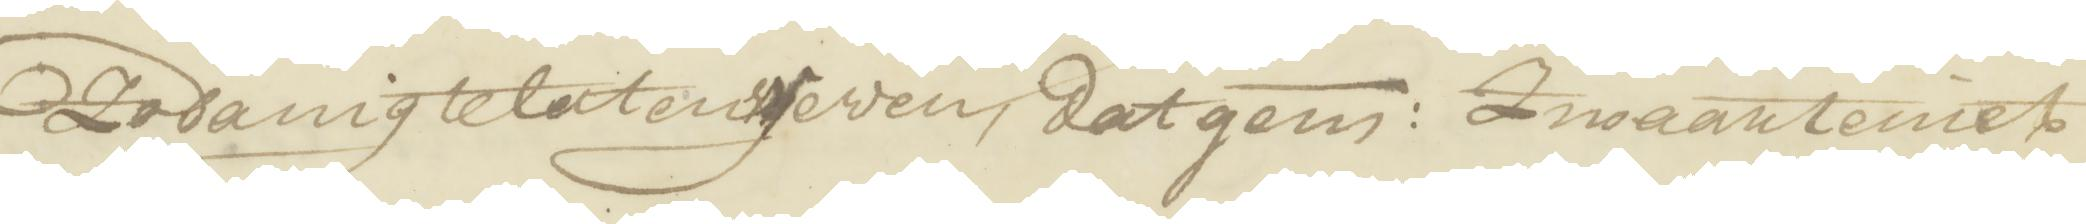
zodanig te laten weven, dat gem: zwaarteniet
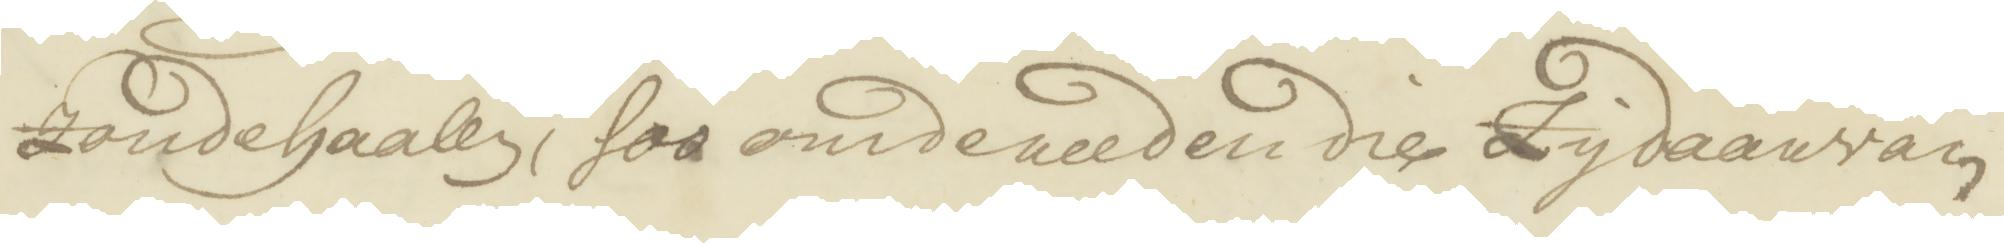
zoudehaalen, soo om de reeden die zij daar van
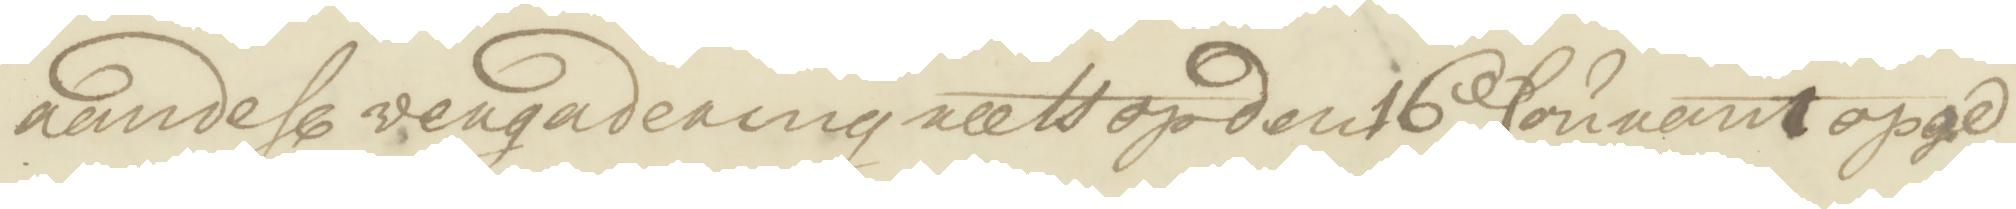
aandese vergadering reets op den 16.' Courant opge
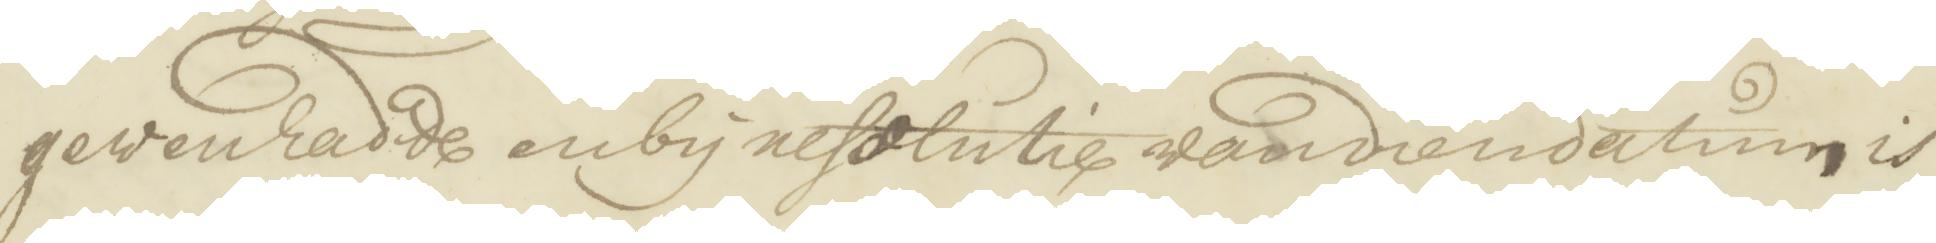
geven hadde en bij resolutie van dien datum is
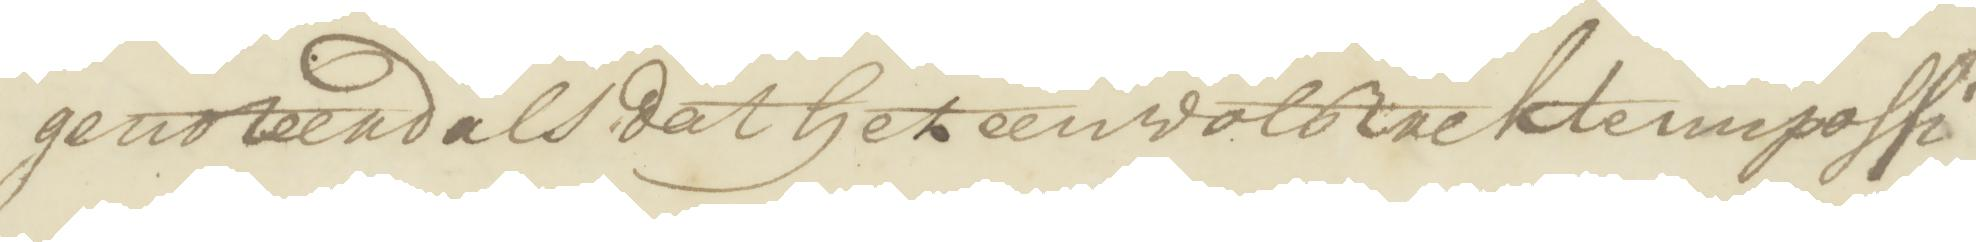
genoteerd als dat het een volstrekte impossi
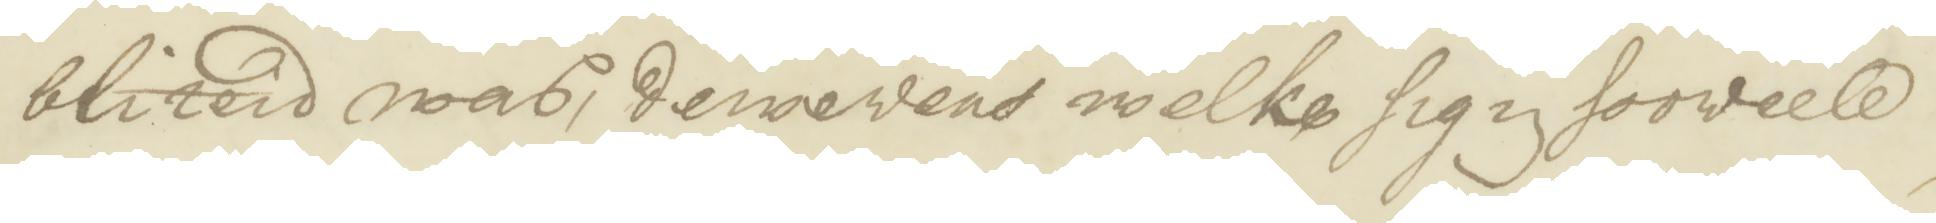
bliteid was, dewevers welke sig in sooveele
